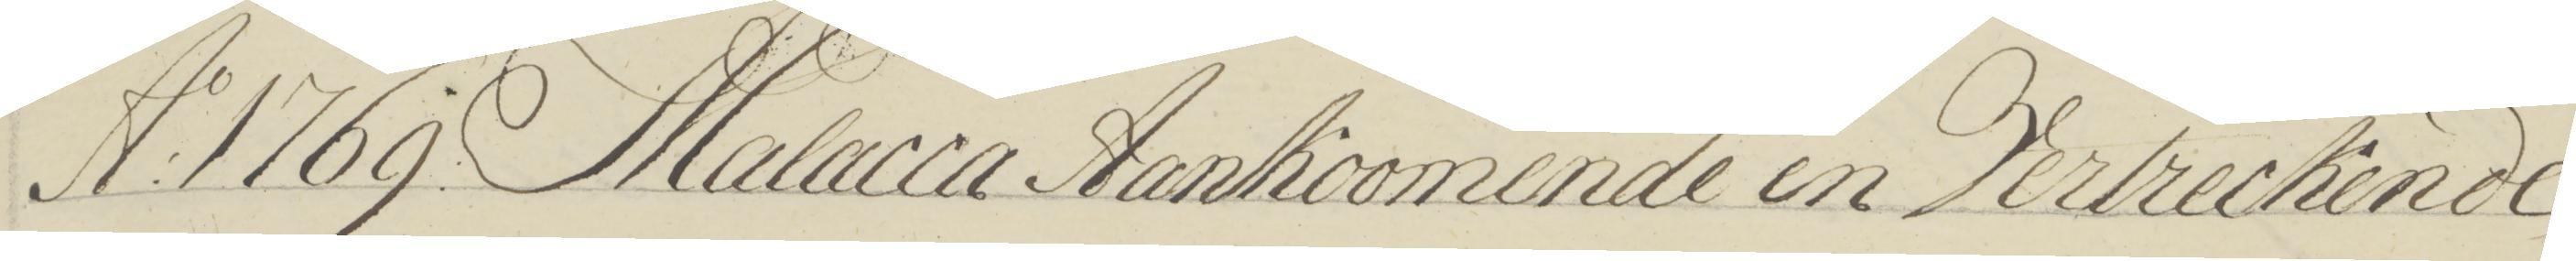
A:o 1769: Malacca Aankoomende en Vertreckende
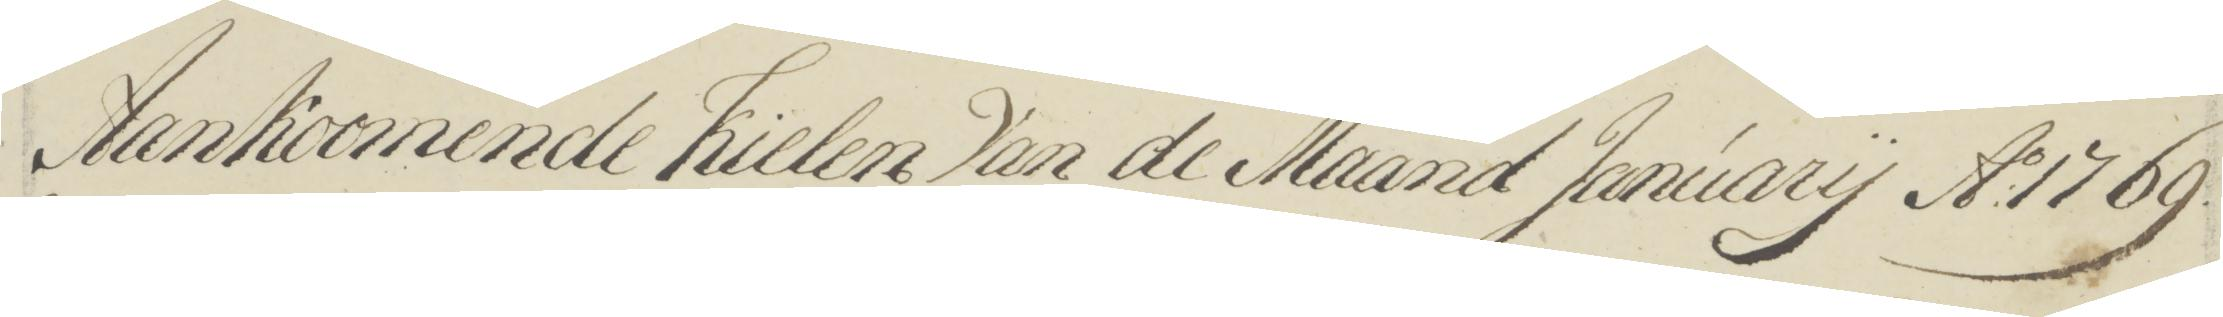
Aankoomende kielen van de Maand Januarij A:o 1769.
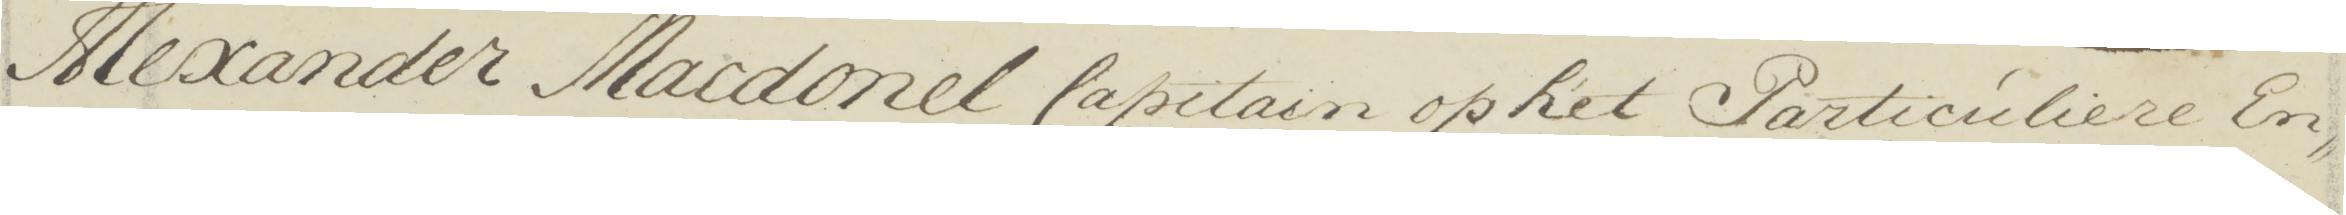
den 1: Janu: Alexander Macdonel Capitain op het Particuliere En„
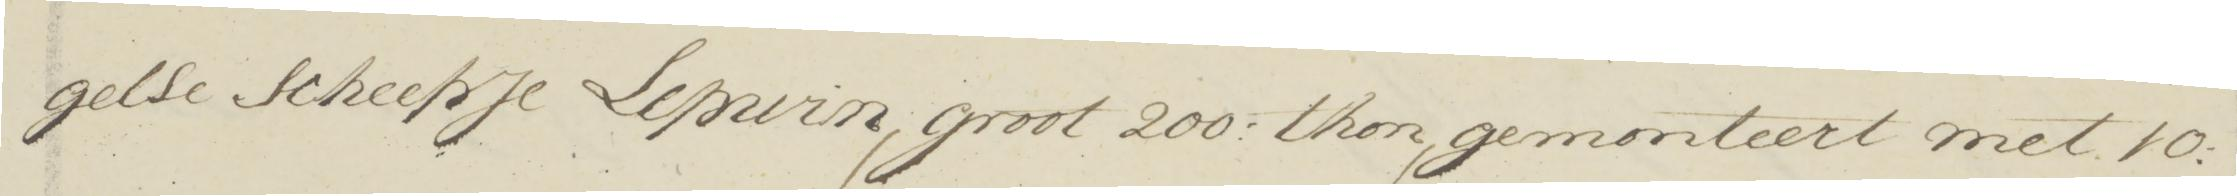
gelse scheepje Lepurn, groot 200: thon, gemonteert met 10:
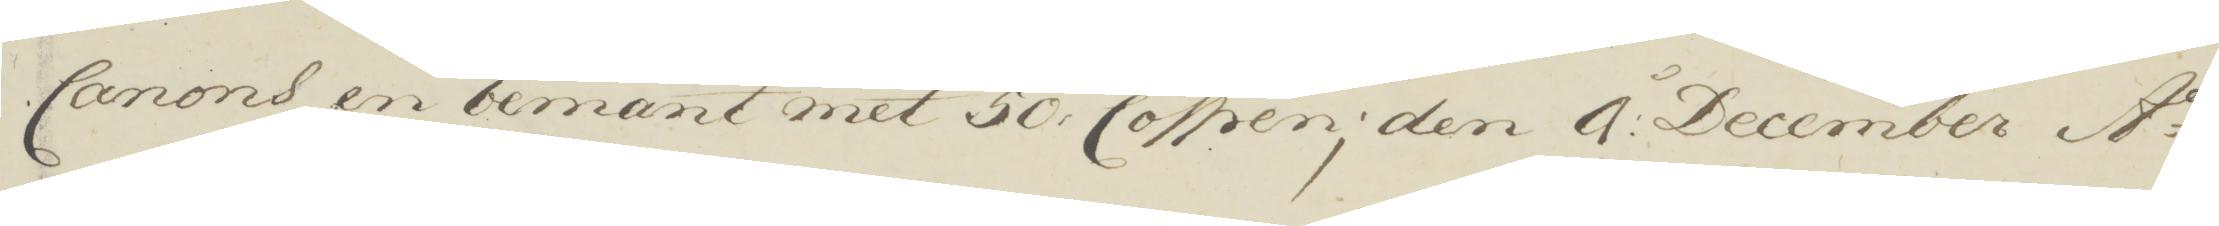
Canons en bemant met 50: Coppen; den 4:' December A=o
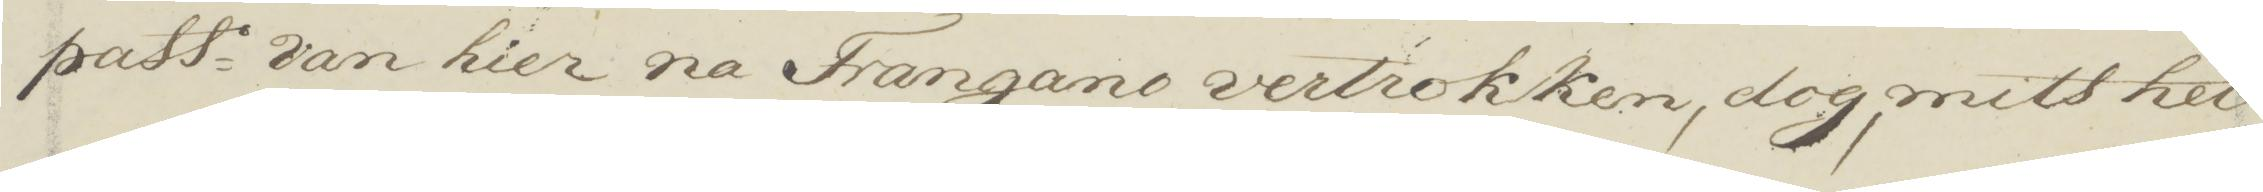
pass=o van hier na Frangano vertrokken, dog, mits het
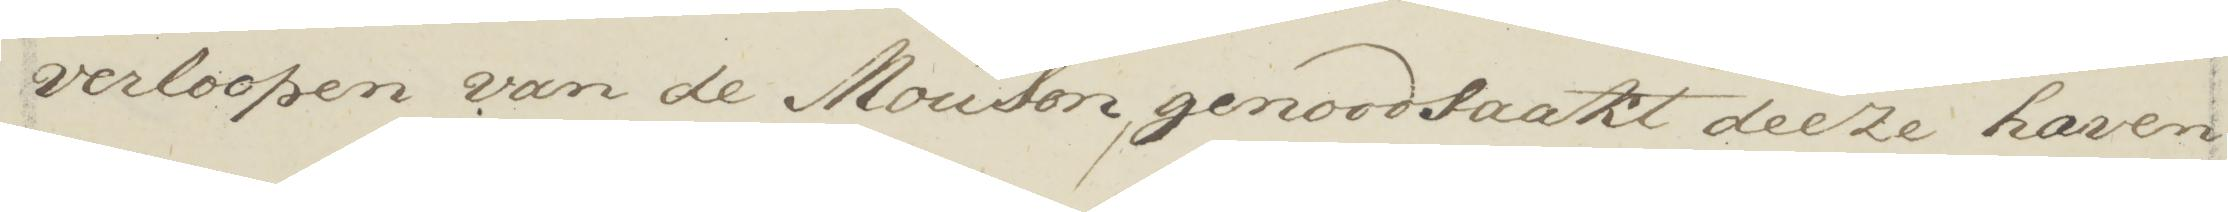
verloopen van de Mouson, genoodsaakt deeze haven
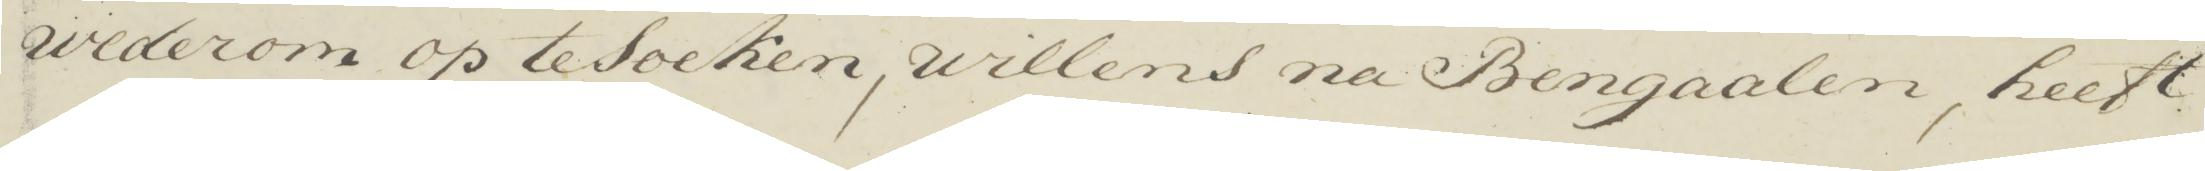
wederom op tesoeken, willens na Bengaalen, heeft
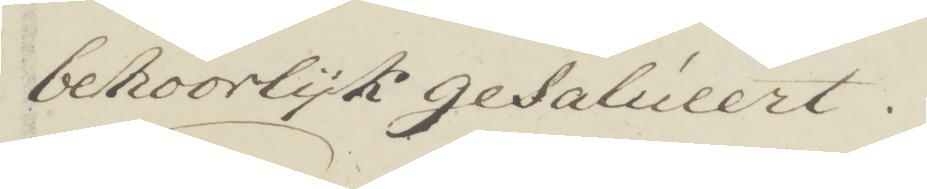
behoorlijk gesalueert.
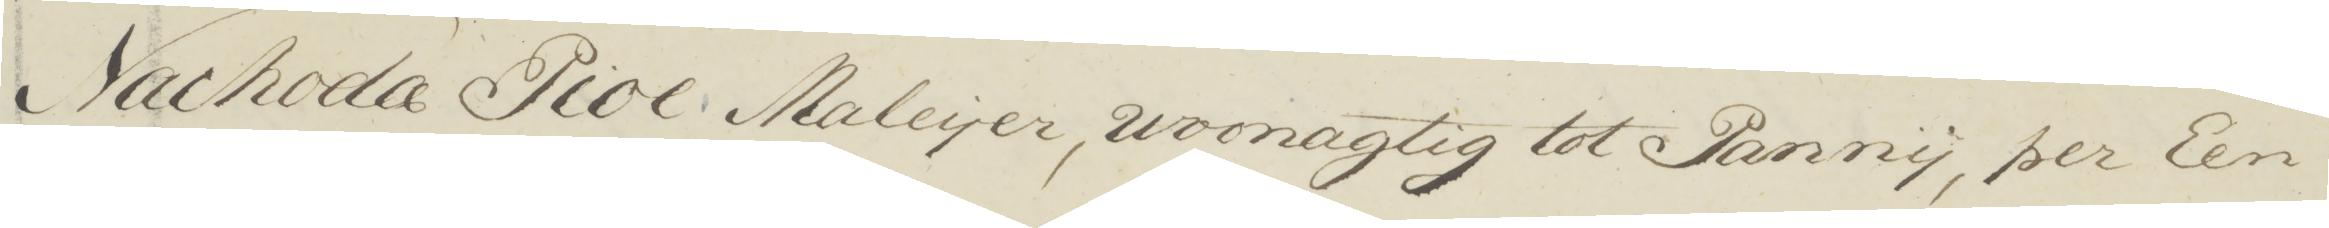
2: _„o Nachoda Piol Maleijer, woonagtig tot Pannij, per Een
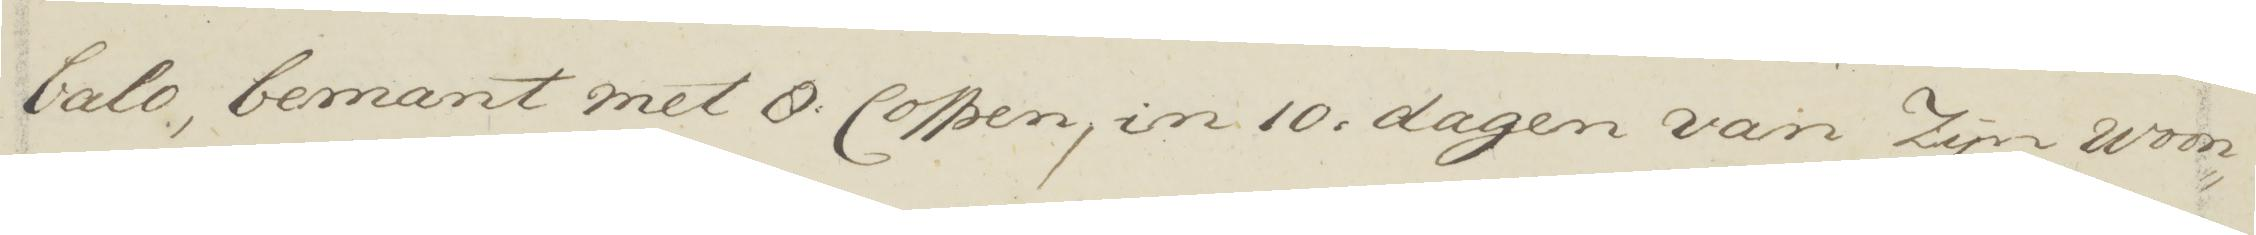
balo, bemant met 8: Coppen, in 10: dagen van zijn woon„
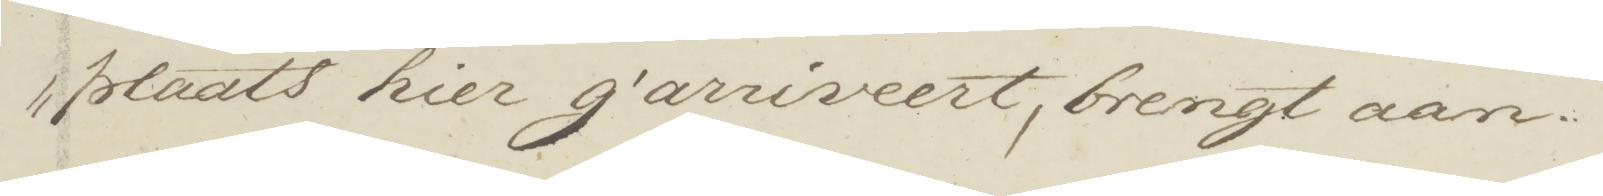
„plaats hier g’arriveert, brengt aan.
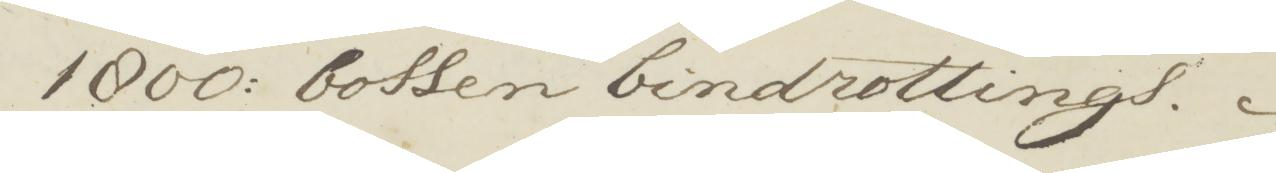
1800: bossen bindrottings.
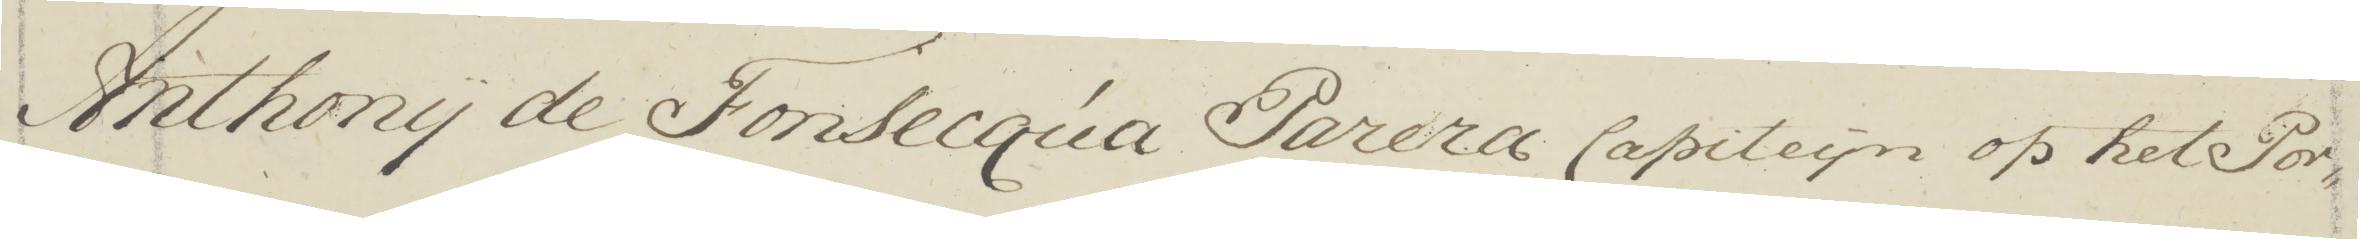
2: _„o Anthonij de Fonsecqua Parera Capiteijn op het Por„
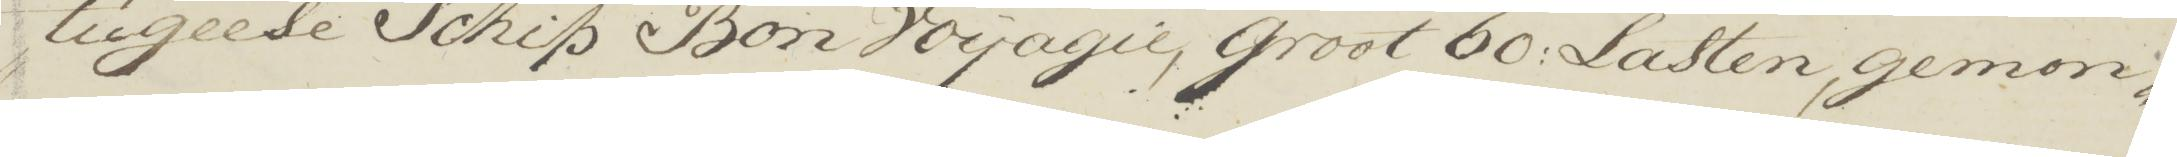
„tugeese Schip Bon Voijagie, groot 60: Lasten, gemon„
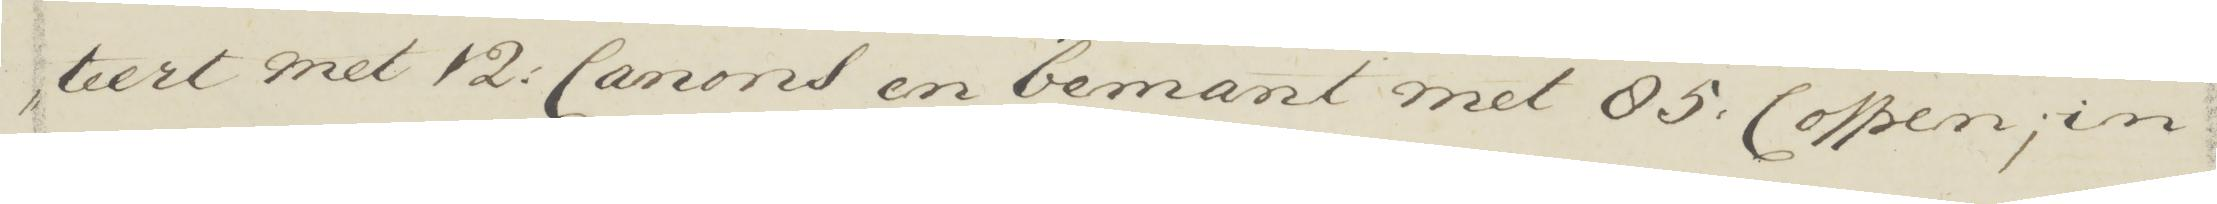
„teert met 12: Canons en bemant met 85: Coppen; in
